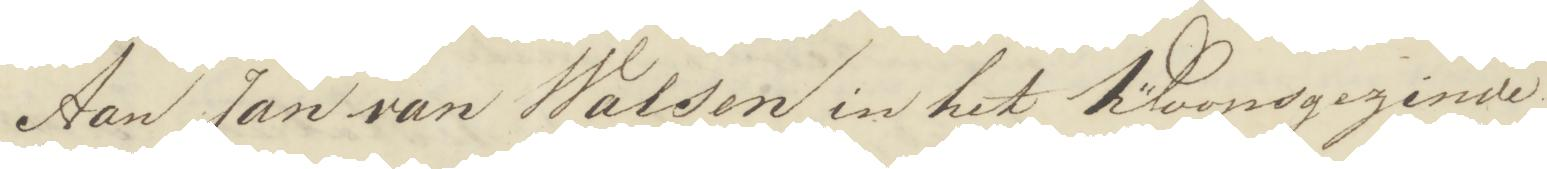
Aan Jan van Walsen in het Doopsgezinde
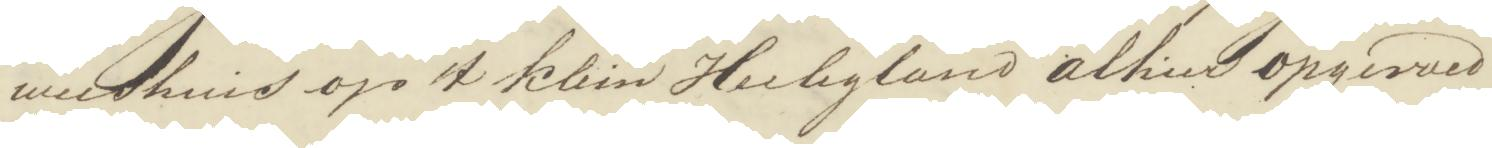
weeshuis op ’t klein Heiligland alhier opgevoed
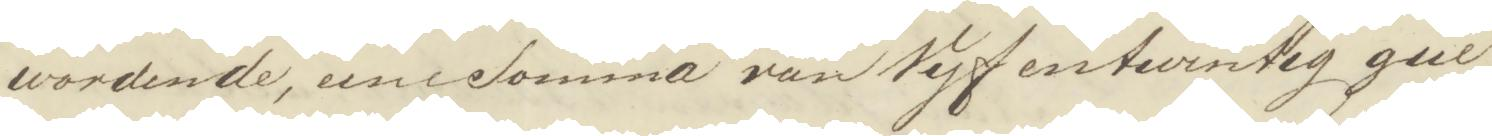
wordende, eene somma van Vyf en twintig gul
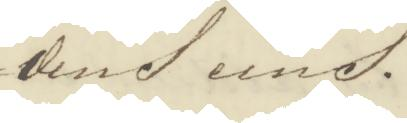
„dens eens. —
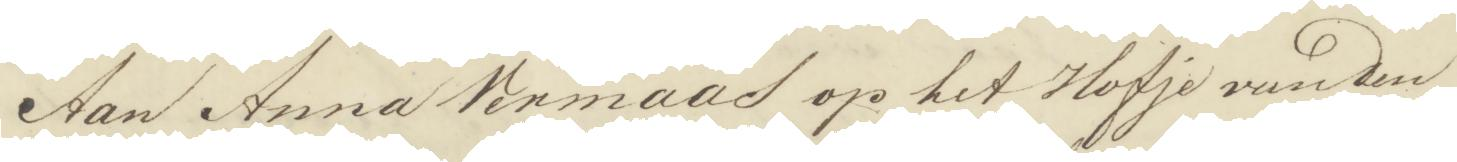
Aan Anna Vermaas op het Hofje van den
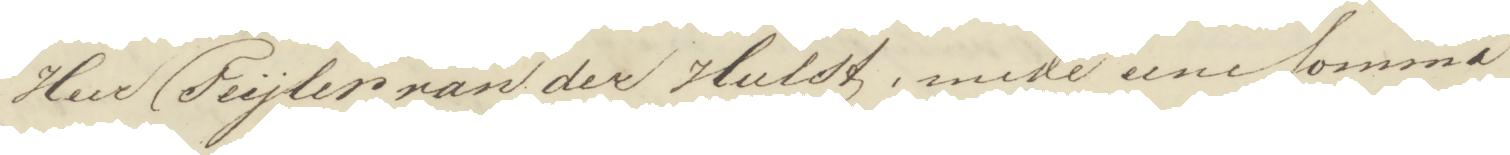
Heer Peijler van der Hulst, mede eene somma
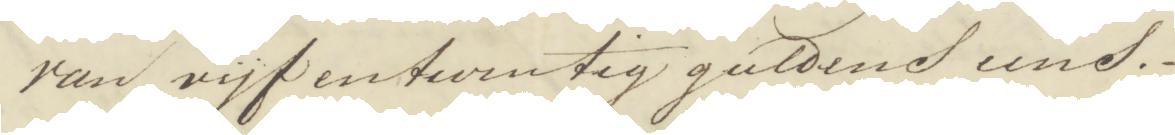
van vijf en twintig guldens eens. —
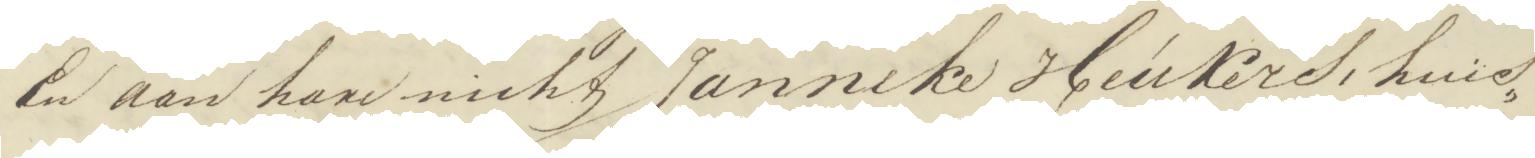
En aan hare nicht Janneke Heukers, huis„
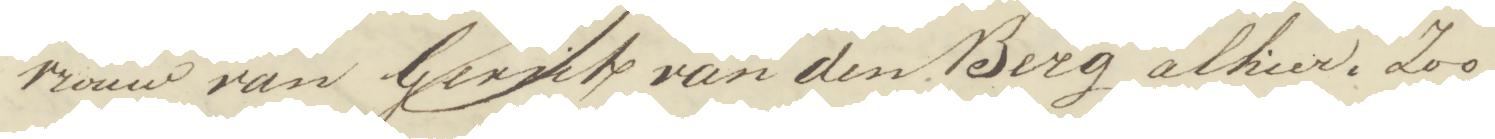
vrouw van Gerrit van den Berg alhier, zoo
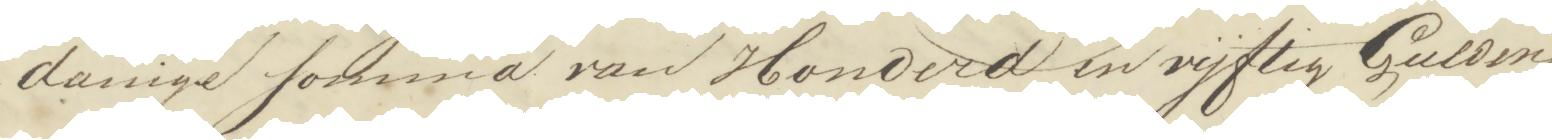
„danige somma van Honderd en vijftig Guldens
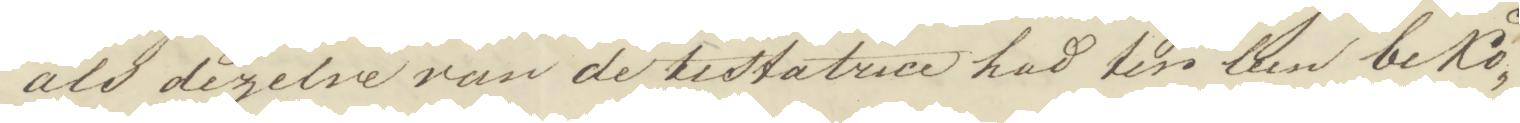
als dezelve van de testatrice had ter leen beko„
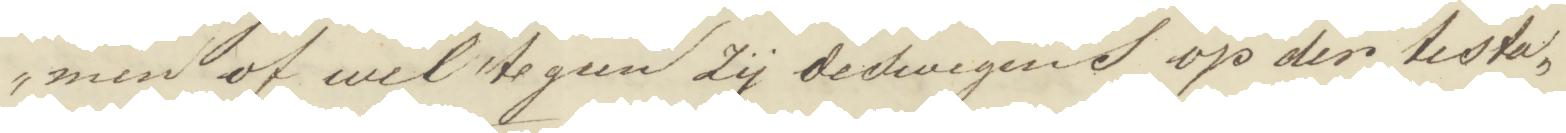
„men of wel te geen zij deswegens op der testa„
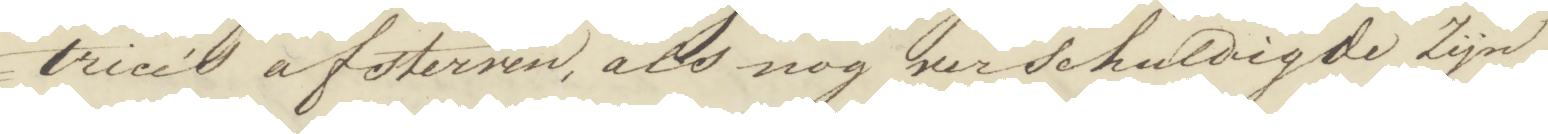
„trices afsterven, als nog verschuldigde zijn
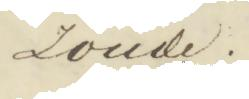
zoude. —
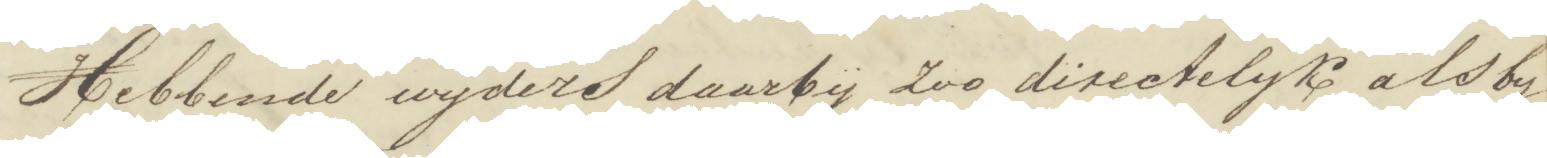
Hebbende wijders daarbij zoo directelyk als by
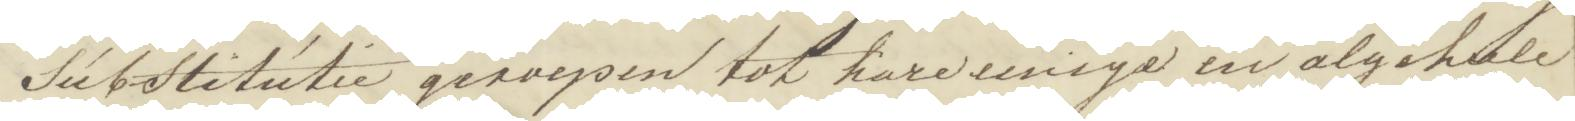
substitutie geroepen tot hare eenige en algeheele
